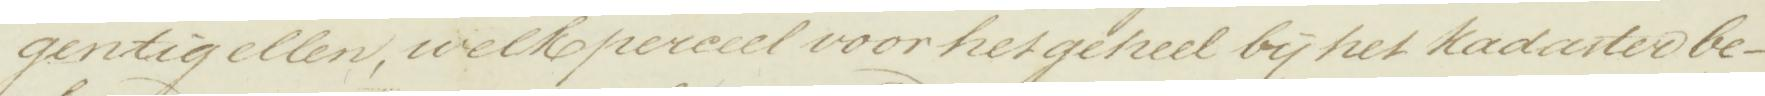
gentig ellen, welk perceel voor het geheel bij het kadaster be-
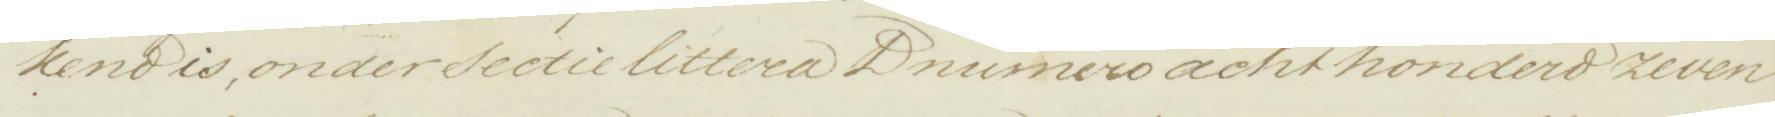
kend is, onder sectie littera D numero acht honderd zeven
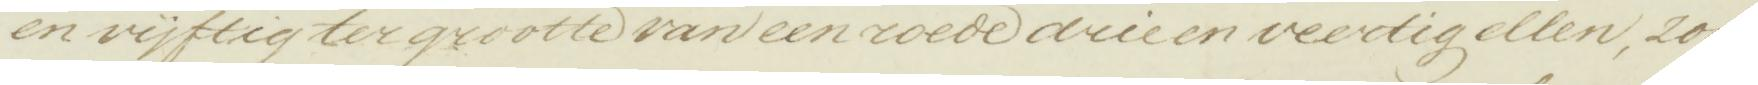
en vijftig ter grootte van een roede drie en veertig ellen, zoo-
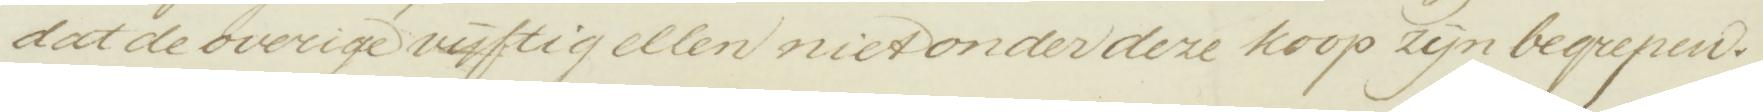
dat de overige vijftig ellen niet onder deze koop zijn begrepen.
